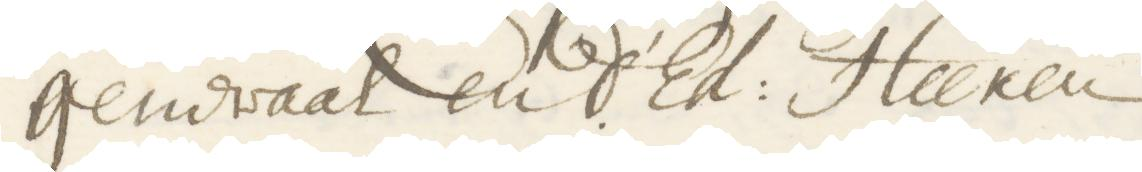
generaal en d’ Ed: Heeren
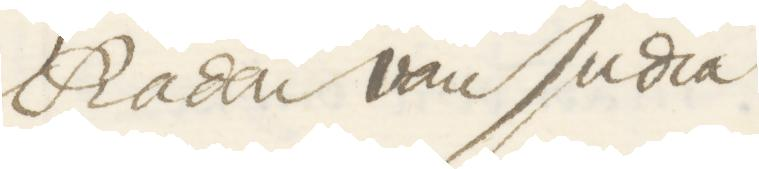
Raden van Jndia
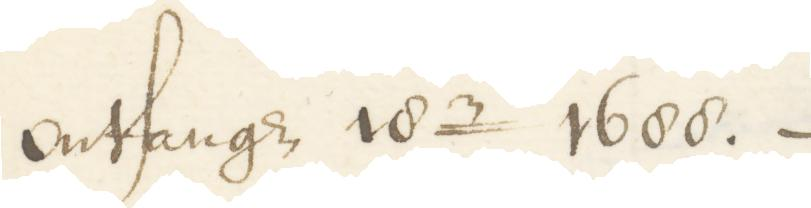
ontfangen 18=en 1688. —
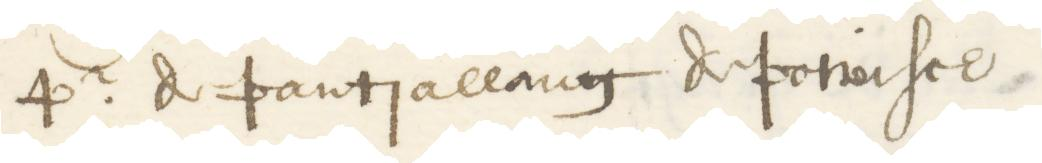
P.r d pantjallang de potreisch
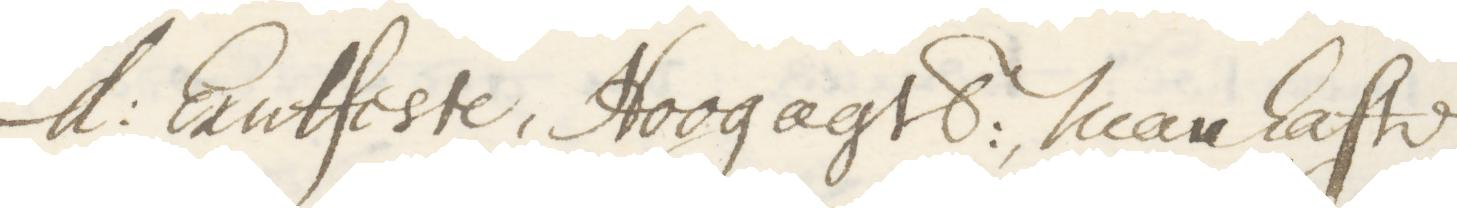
d: Erntfeste, Hoog agtb:e manhafte
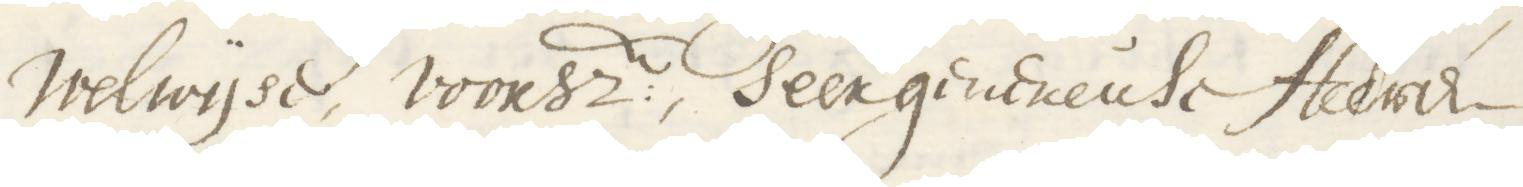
welwijse, voorsz:e, seer genereuse Heeren.
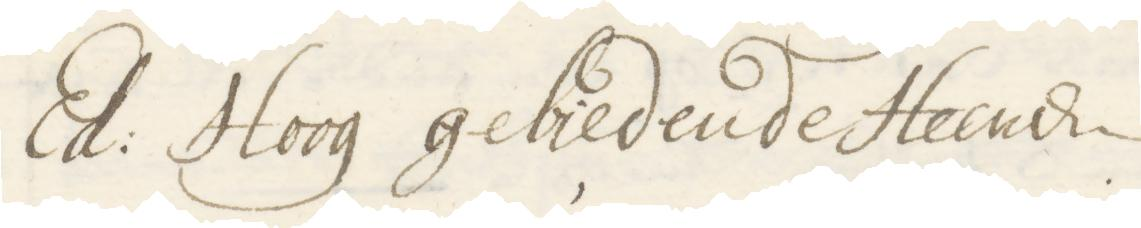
Ed: Hoog gebiedende Heeren
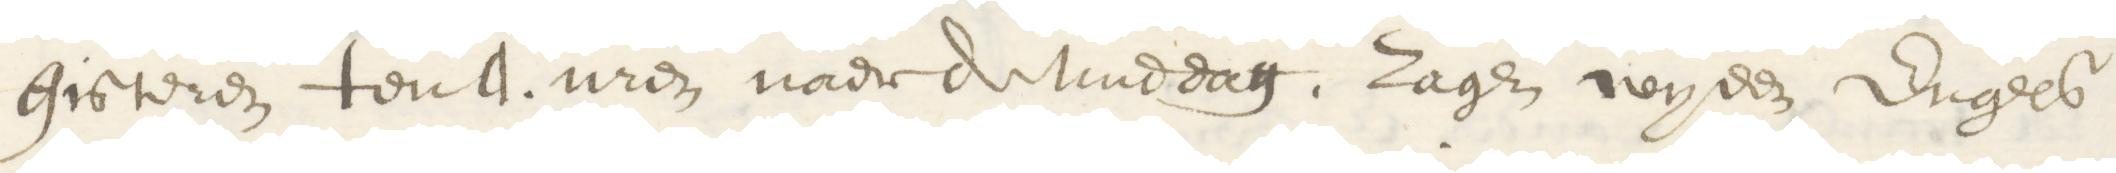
gisteren ten 4. uren naer de middag. zagen wij een Engels
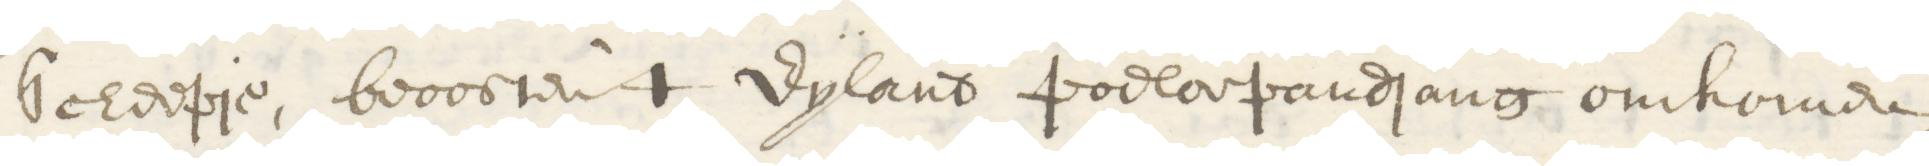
scheepje, beoosten 't Eijland poeloepandjang omkomen
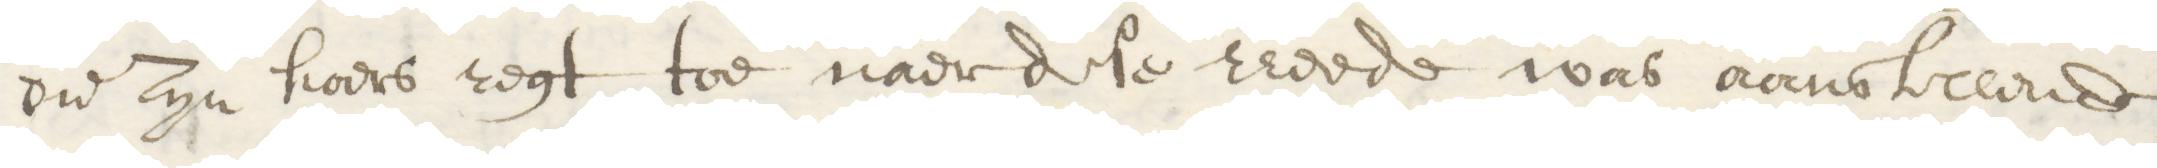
die zyn koers regt toe naer dese rheede was aansbelend
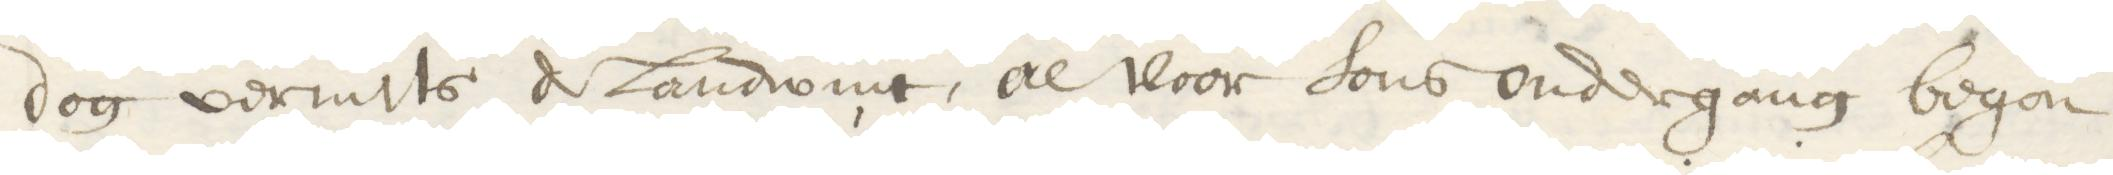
dog vermits de landwint, al voor sonsondergang begon
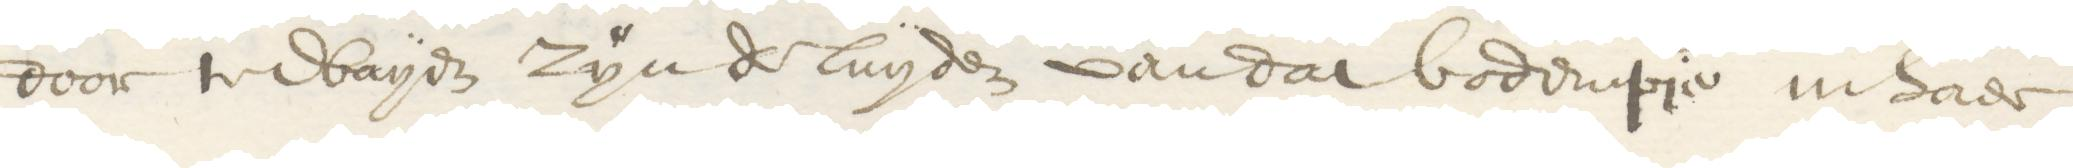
door te waijen zijn de luijden van dat bodempje in haer
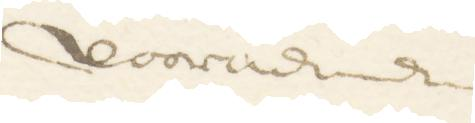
voornemen
